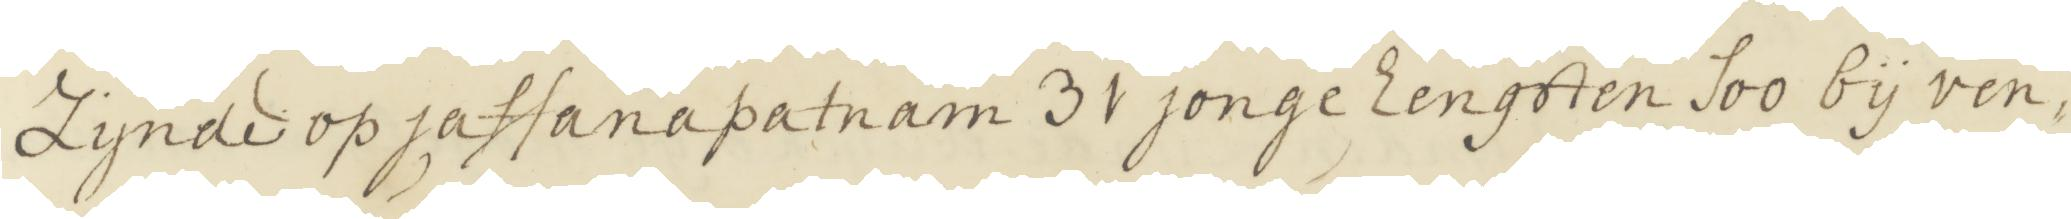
zijnde op jaffanapatnam 31 jonge hengsten soo bij ven„
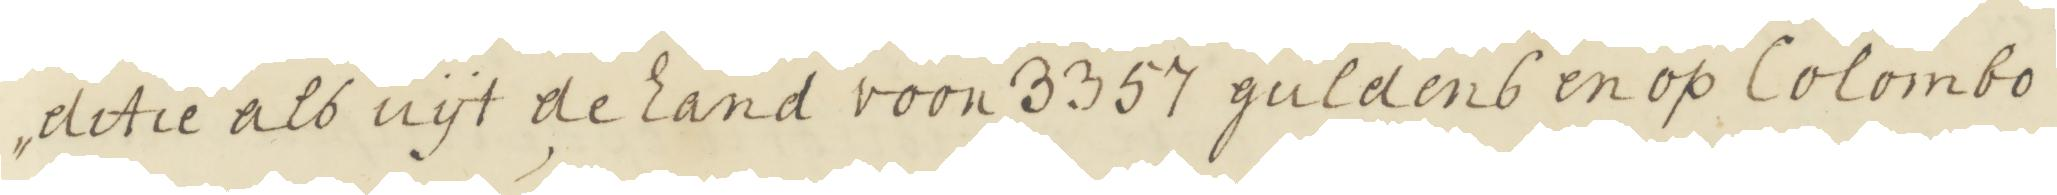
„ditie als uijt de hand voor 3357 guldens en op Colombo
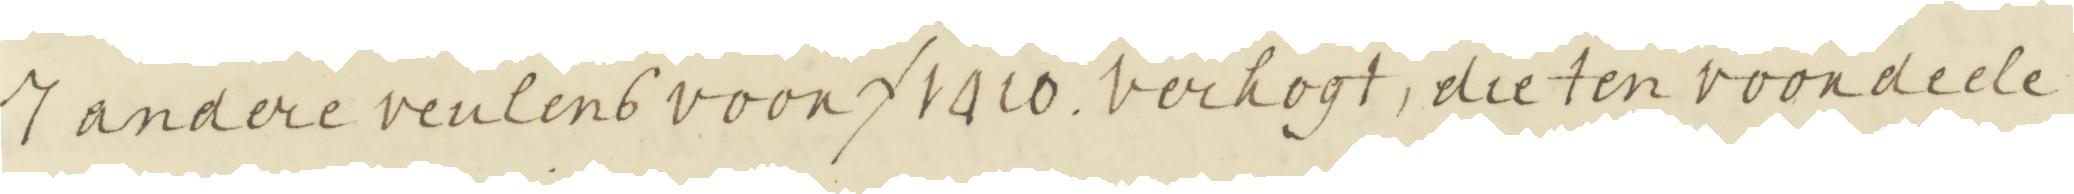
7 andere veulens voor ƒ 1410. verkogt, die ten voordeele
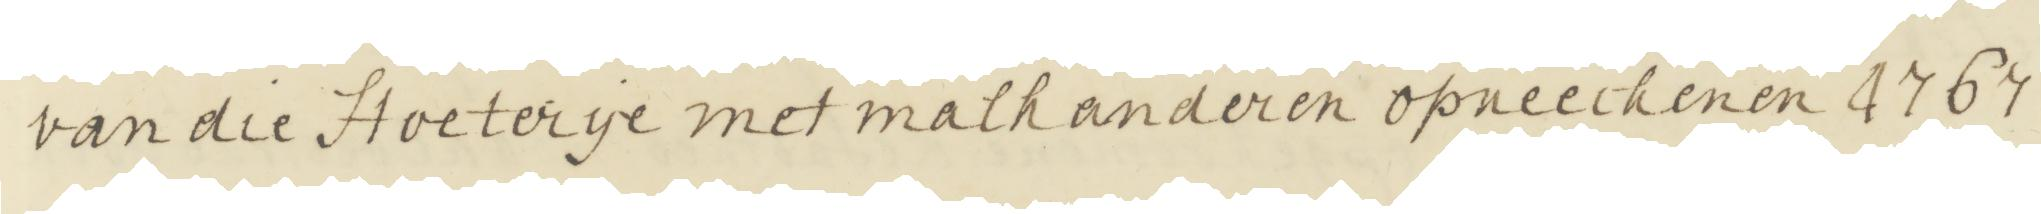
van die stoeterije met malkanderen opreeckenen 4767
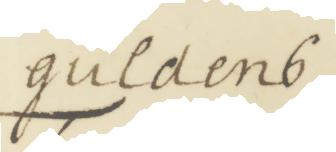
guldens
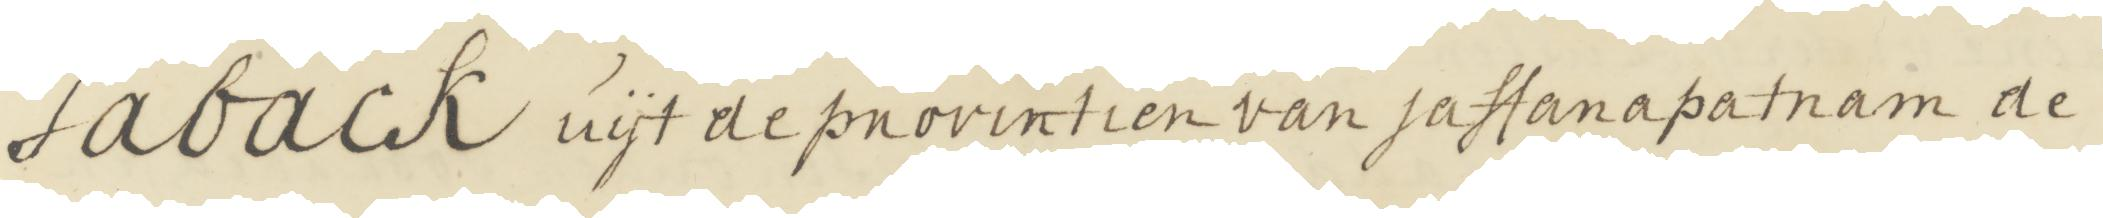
Taback uijt de provintien van jaffanapatnam de
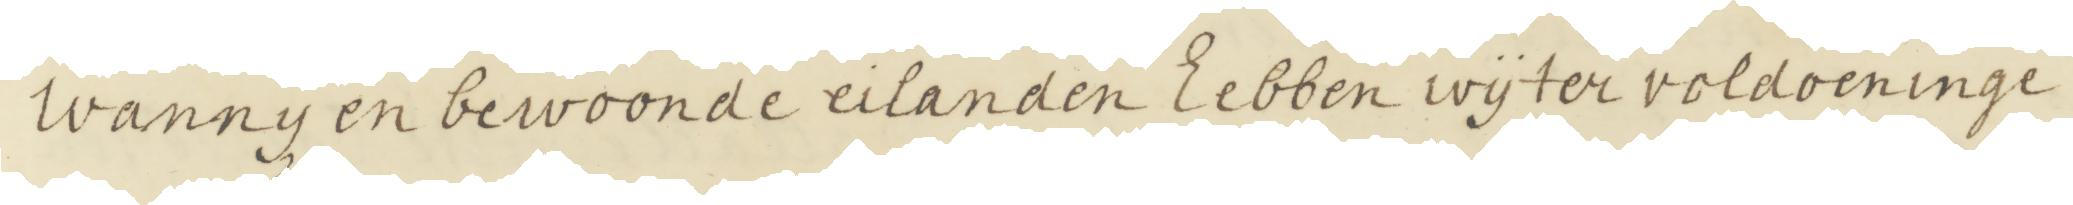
wannij en bewoonde eilanden hebben wij ter voldoeninge
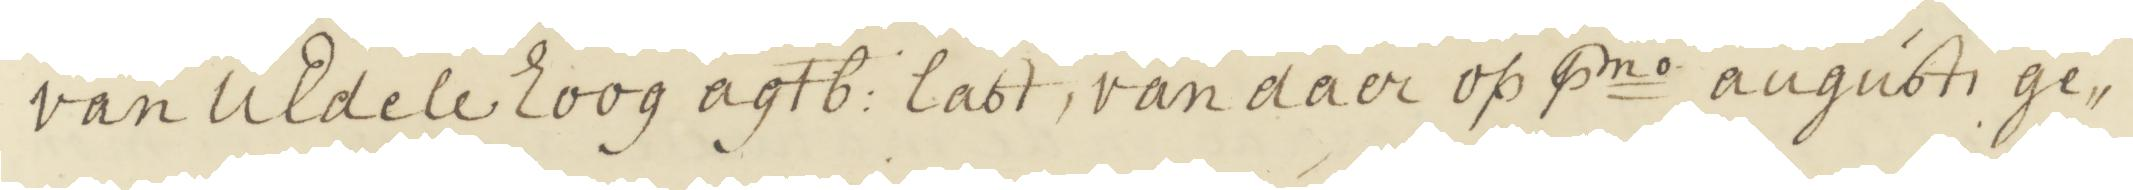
van u Edele hoog agtb: last, van daer op p=mo augusti ge„
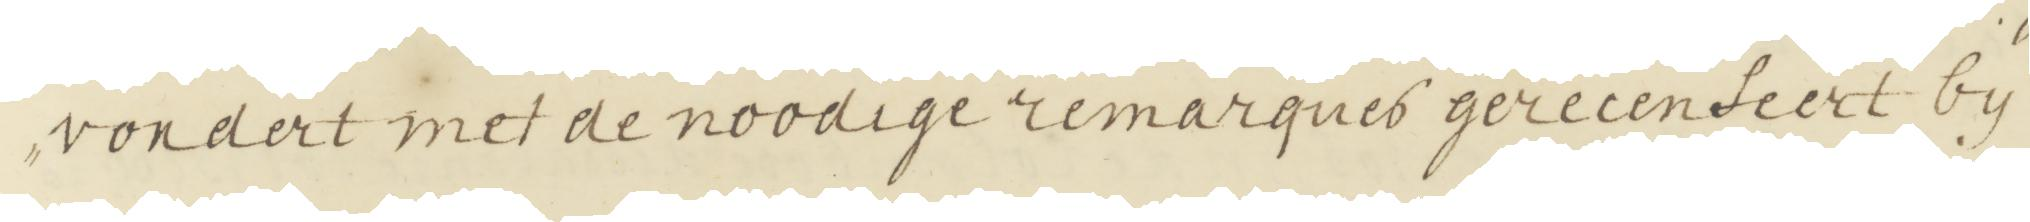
„vordert met de noodige remarques gerecenseert bij
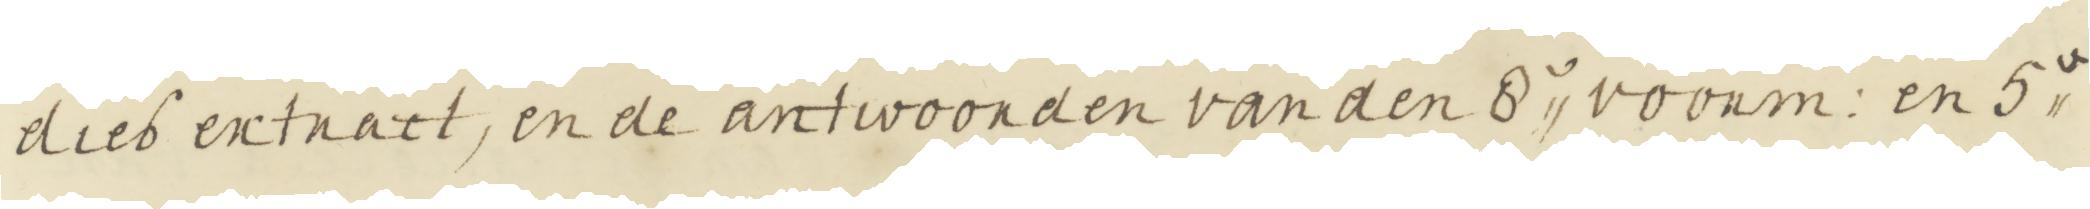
dies extract, en de antwoorden van den 8„' voorm: en 5„'
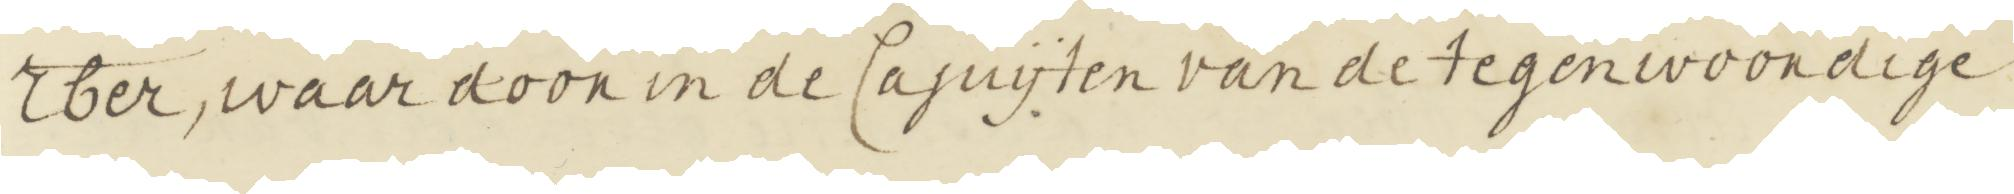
7ber, waar door in de Cajuijten van de tegenwoordige
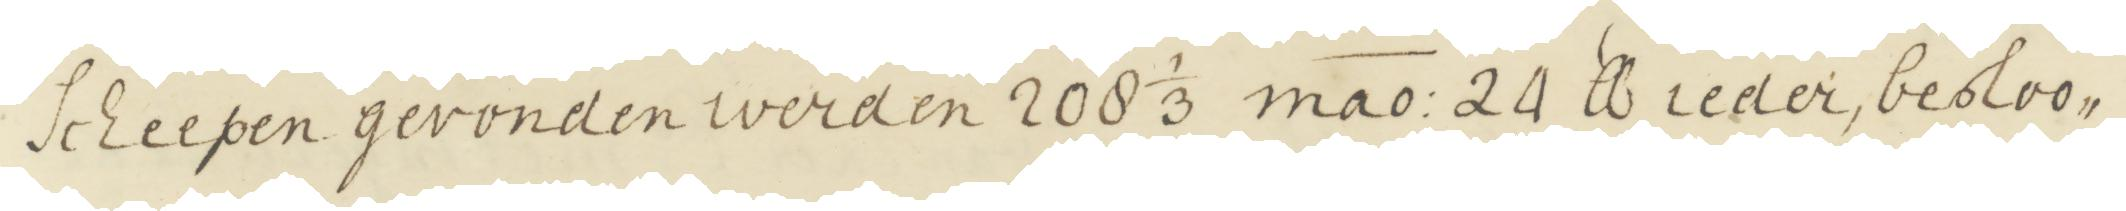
scheepen gevonden werden 208 1/3 mao: 24 lb ieder, besloo„
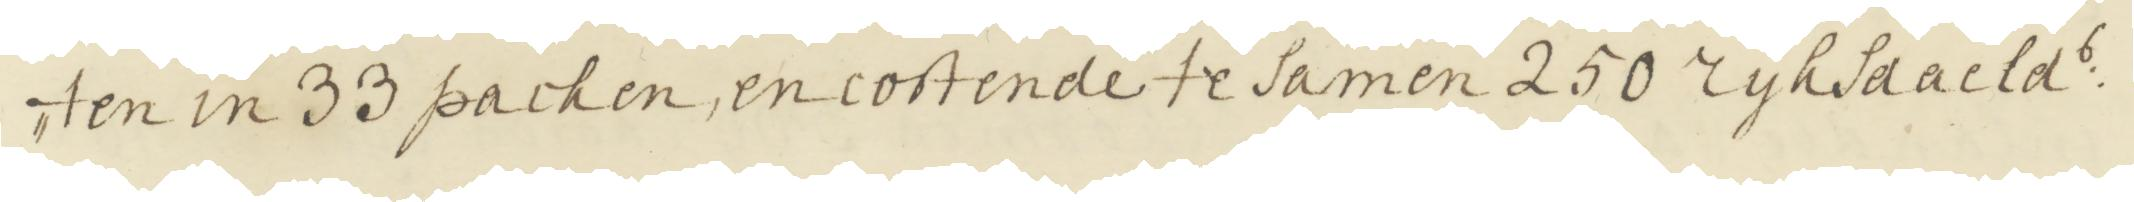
„ten in 33 packen, en costende te samen 250 rijksdaeld:s
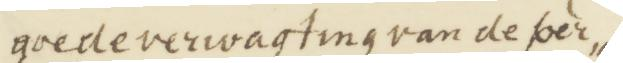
goede verwagting van de per„
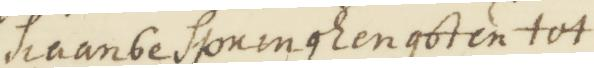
siaanse springhengsten tot
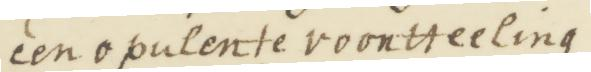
een opulente voortteeling
